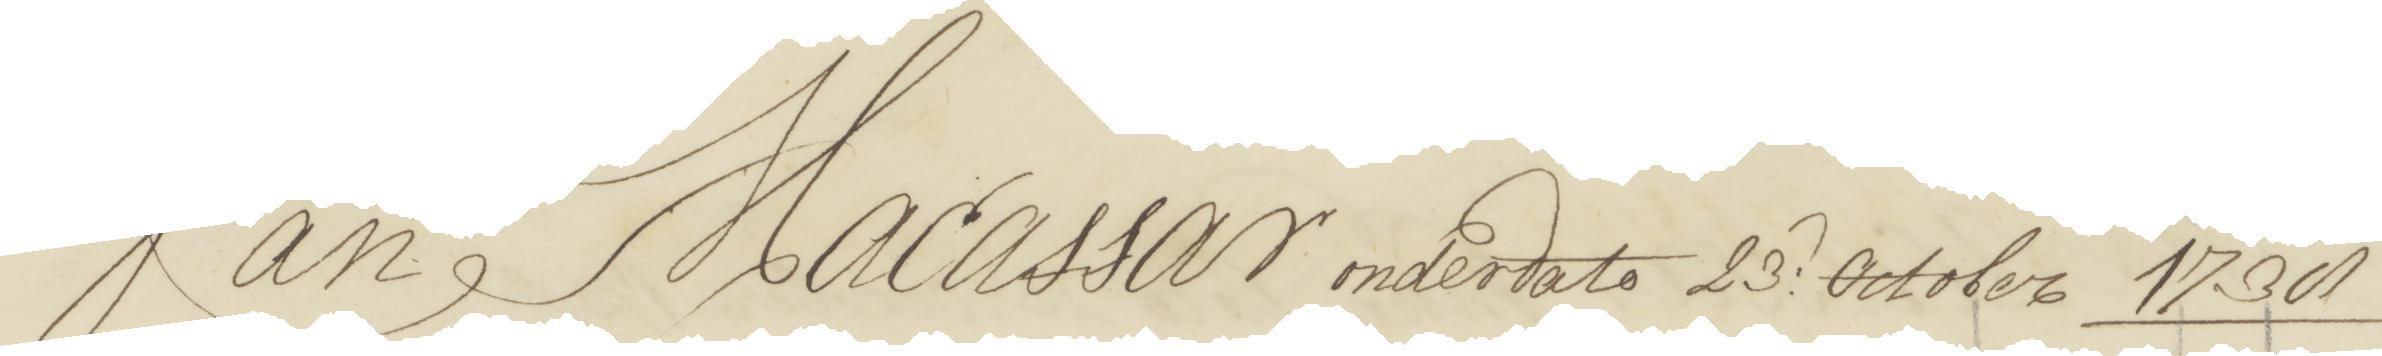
Van Macassar onder dato 23:' october 1738
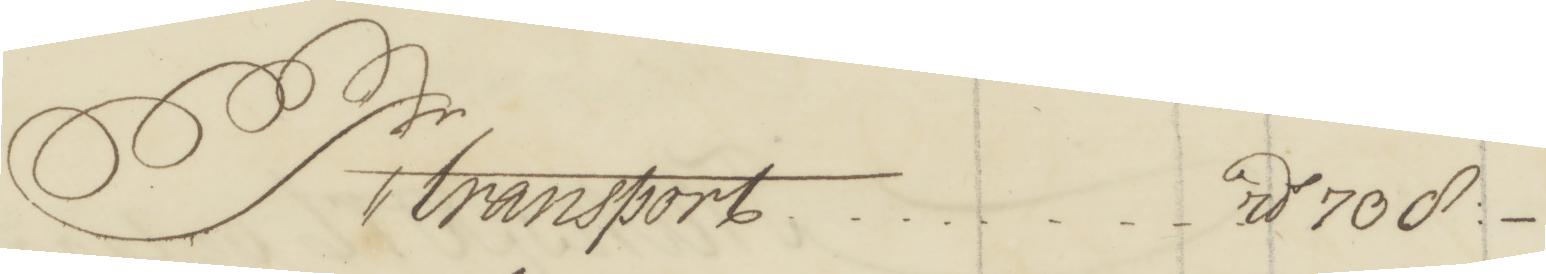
P„r transport . . . . . . . rds 708: —
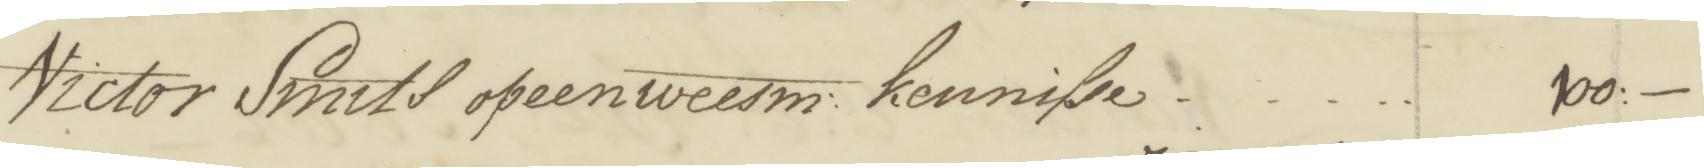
Victor Smits opeenweesm: kennisse . . . . 100: —
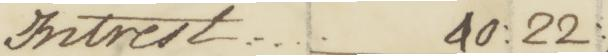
Intrest . . . 40: 22:
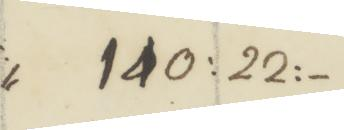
„ 140: 22: -
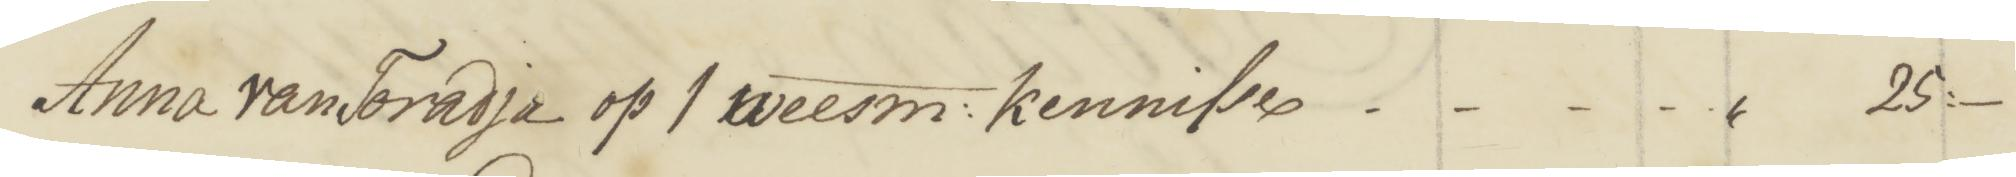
Anna van Toradja op 1 weesm: kennisse . . . . „ 25: —
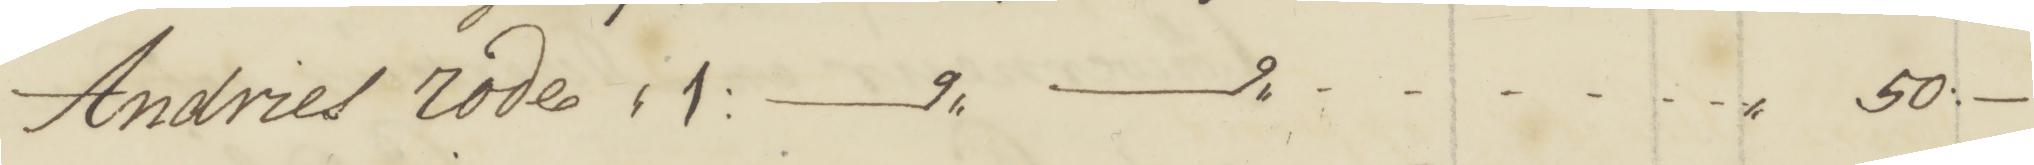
Andries rode „ 1: _„o _„o „ . . . . . . „ 50: —
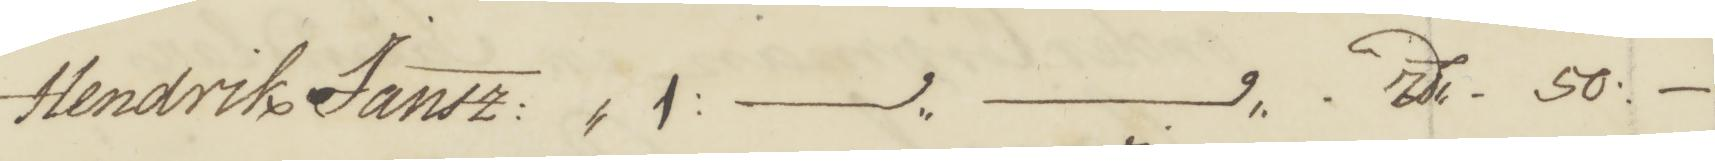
Hendrik Jansz: „ 1: _„o _„o . rd„s . 50: —
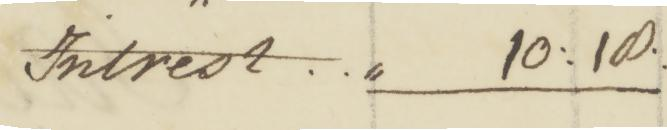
Intrest . . „ 10: 18:
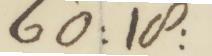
60: 18:
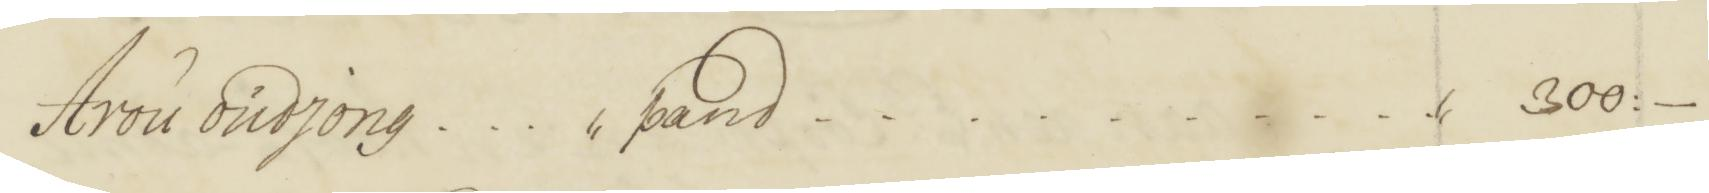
Arou oudjong . . . „ pand . . . . . . . . . „ 300: —
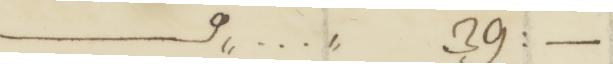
_„o . . „ 39: —
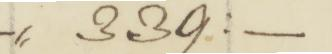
„ 339: —
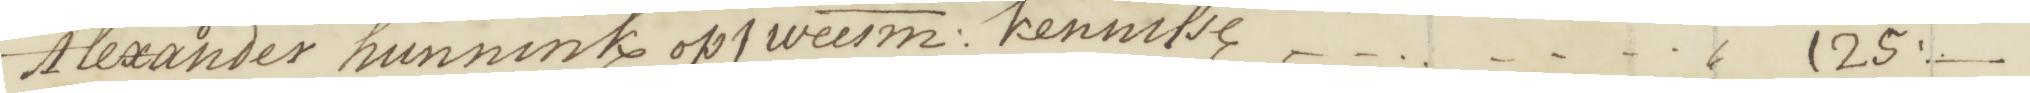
Alexander hunnink op 1 weesm: kennisse . . . . . . . . „ 125: —
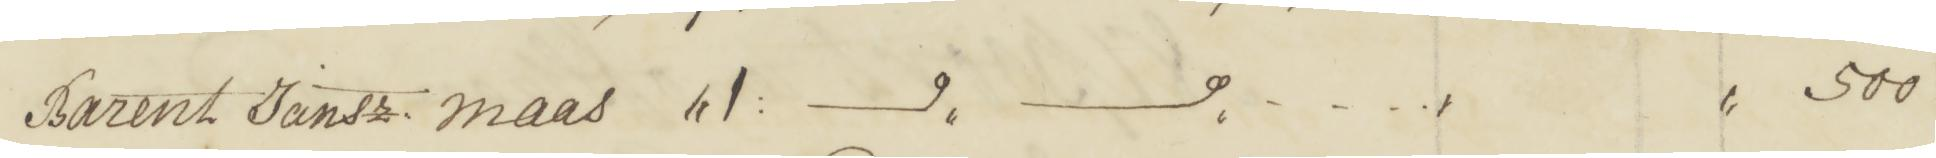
Barent Jansz: maas „ 1: _„o _„o . . . „ „ 500
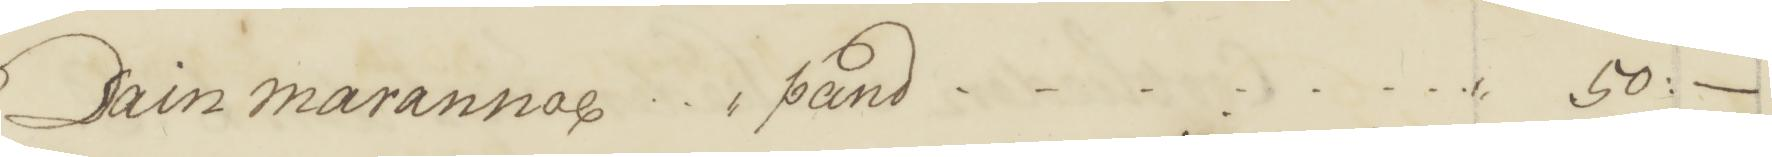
Dain marannoe . . „ pand . . . . . . . „ 50: —
